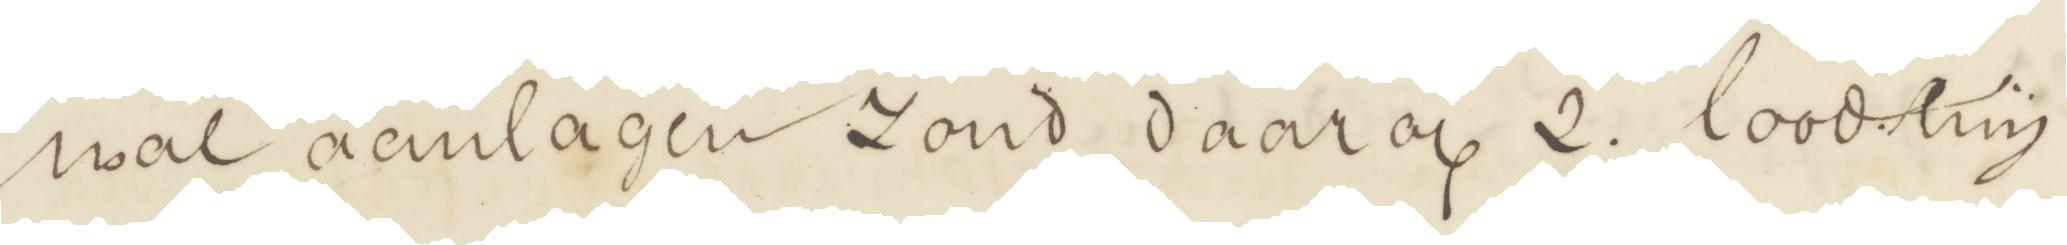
wal aanlagen zond daar op 2. loodsluij
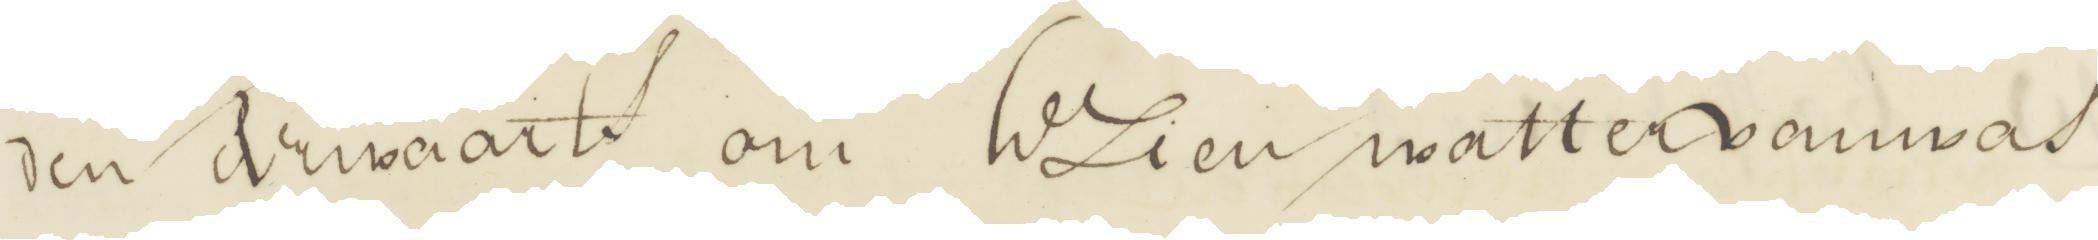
den derwaarts om te zien watter vanwas
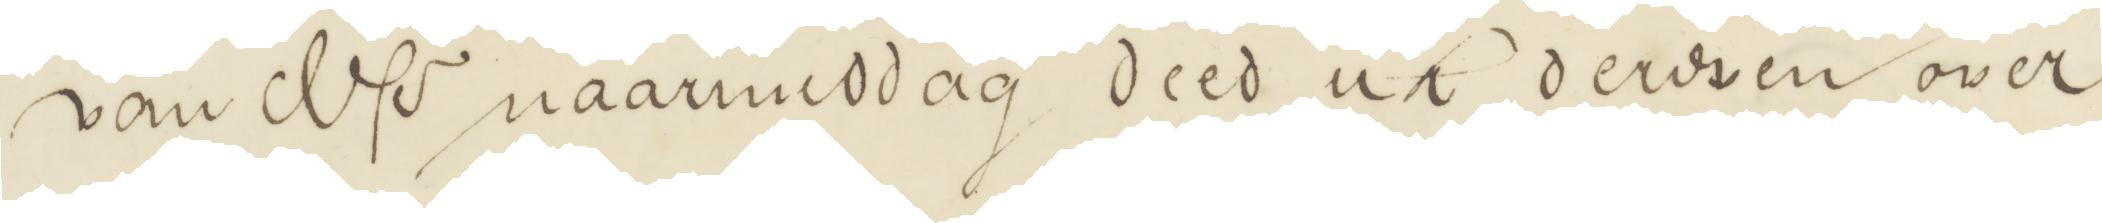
van dese naarmiddag deed ick dereven over
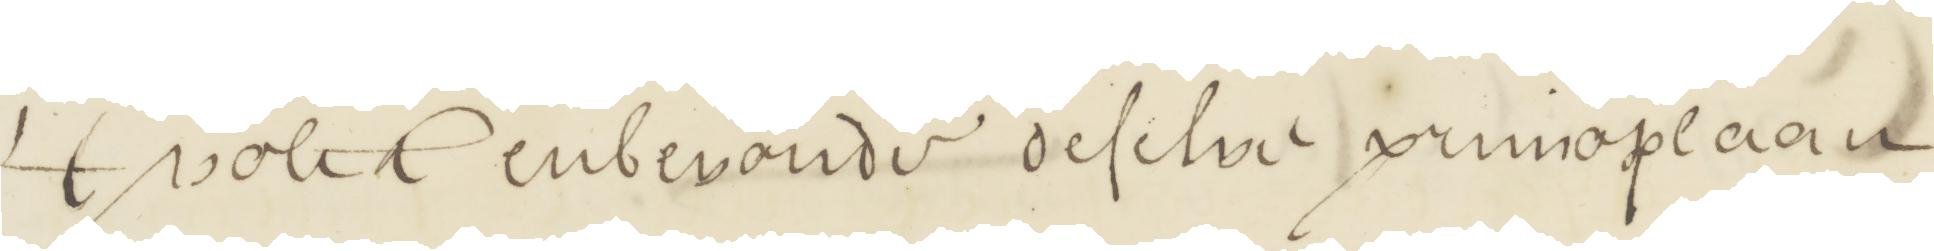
't volck enbevonde deselve primoplaan
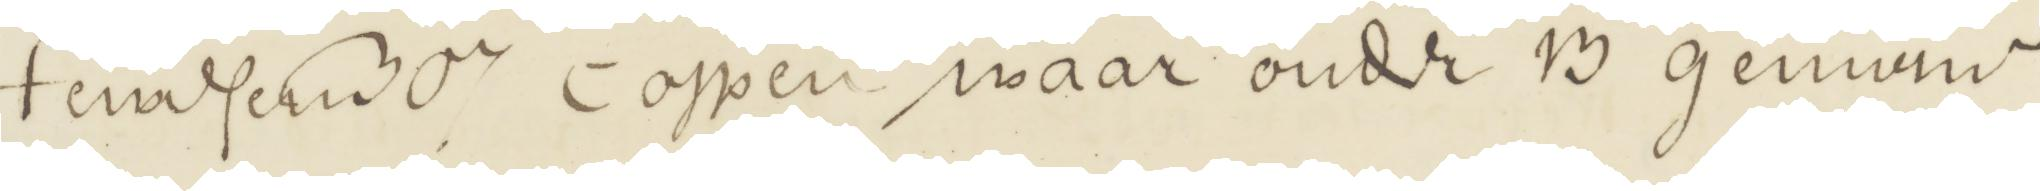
tewesen 307 Coppen waar onder 13 gemene
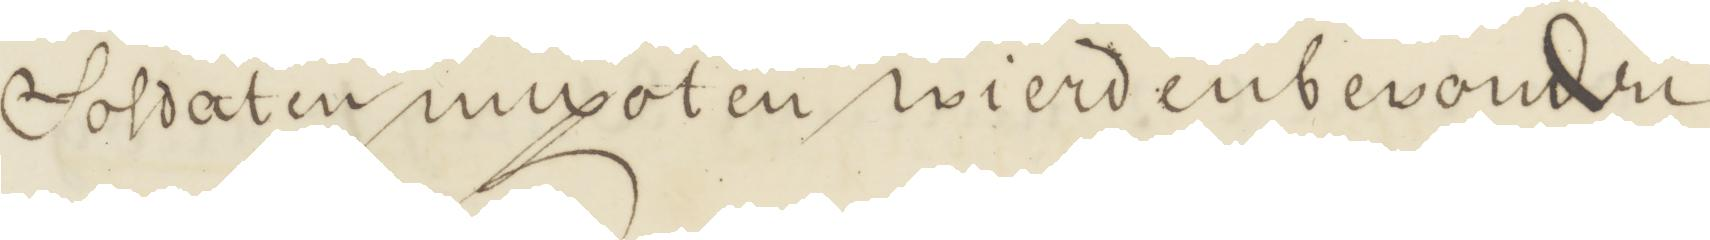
Soldat en impoten wierden bevonden
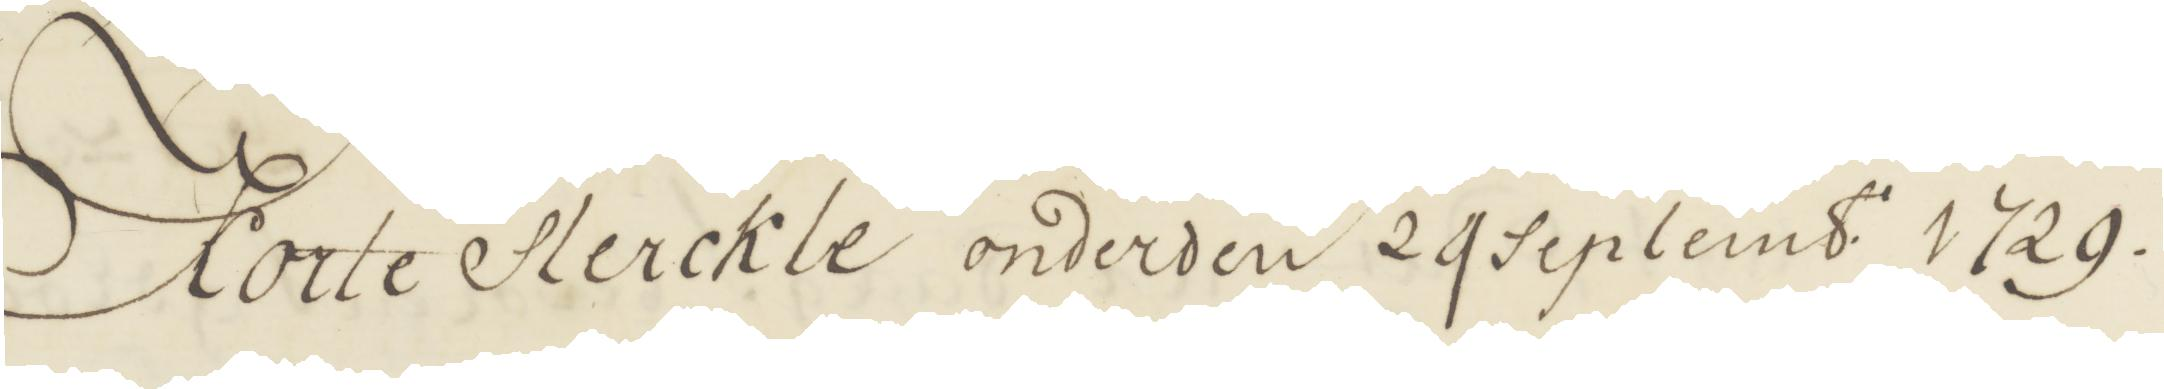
Korte Sterckte onder den 24 septemb. 1729.
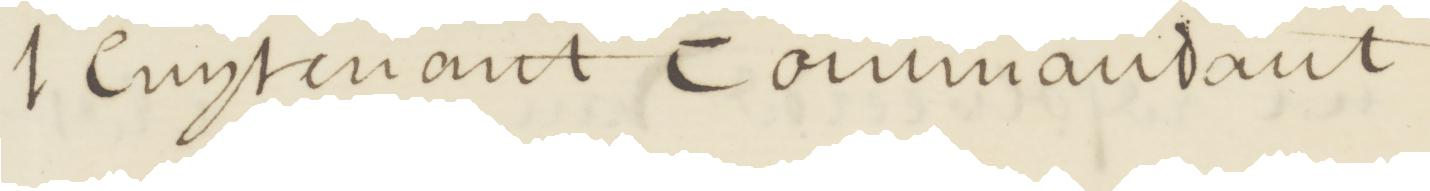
1 luijtenant Commandant
